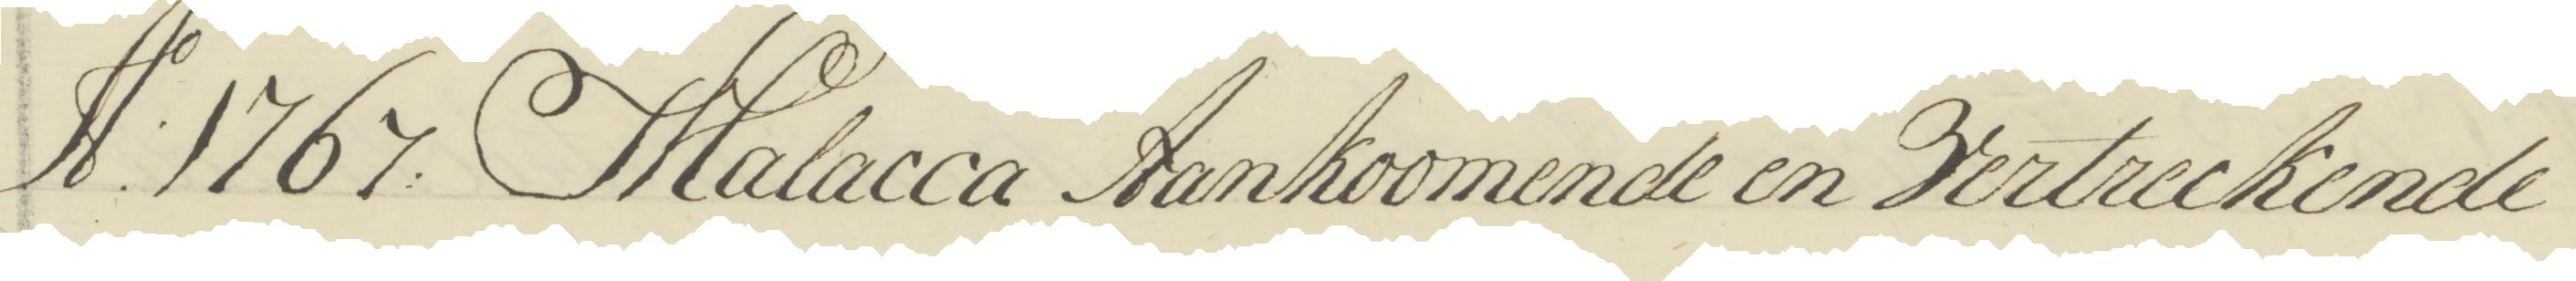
A:o 1767: Malacca Aankoomende en Vertreckende
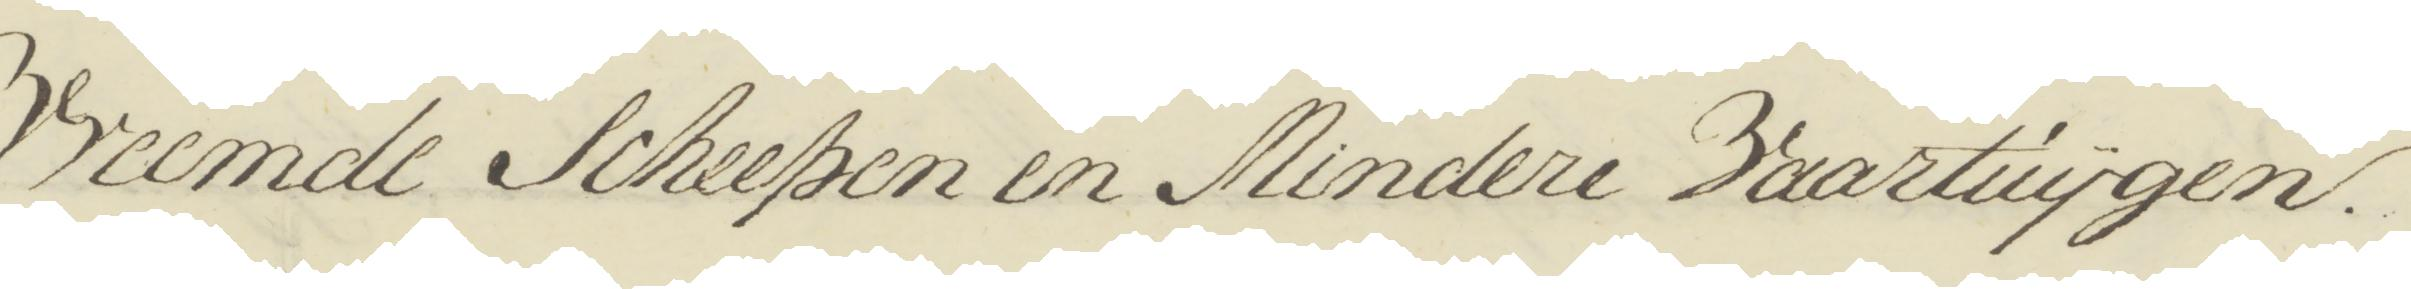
Vreemde scheepen en Mindere Vaartuijgen.
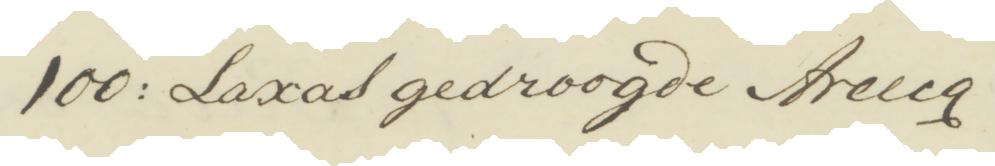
100: Laxas gedroogde Areecq
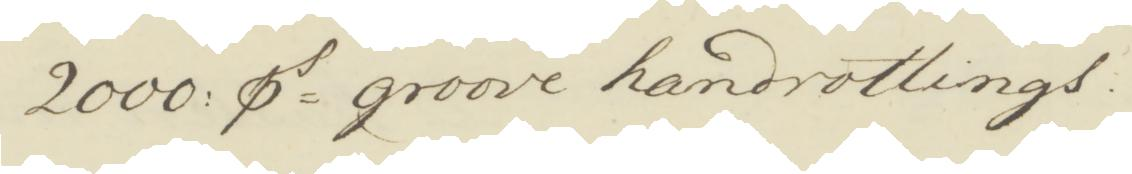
2000: p=s groove handrottings.
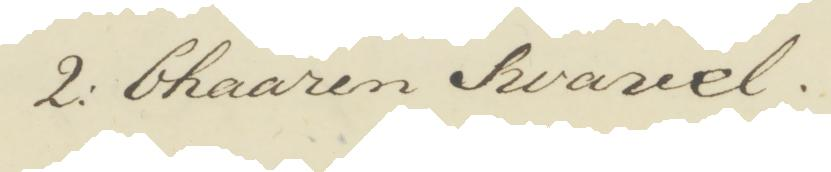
2: bhaaren swavel.
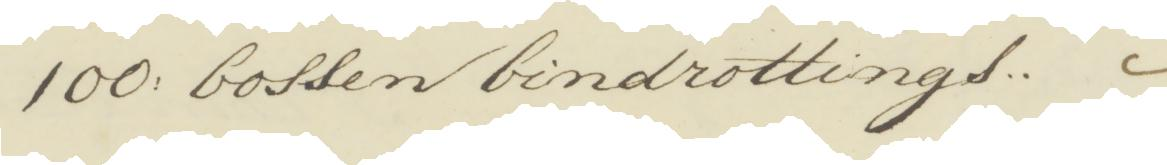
100: bossen bindrottings..
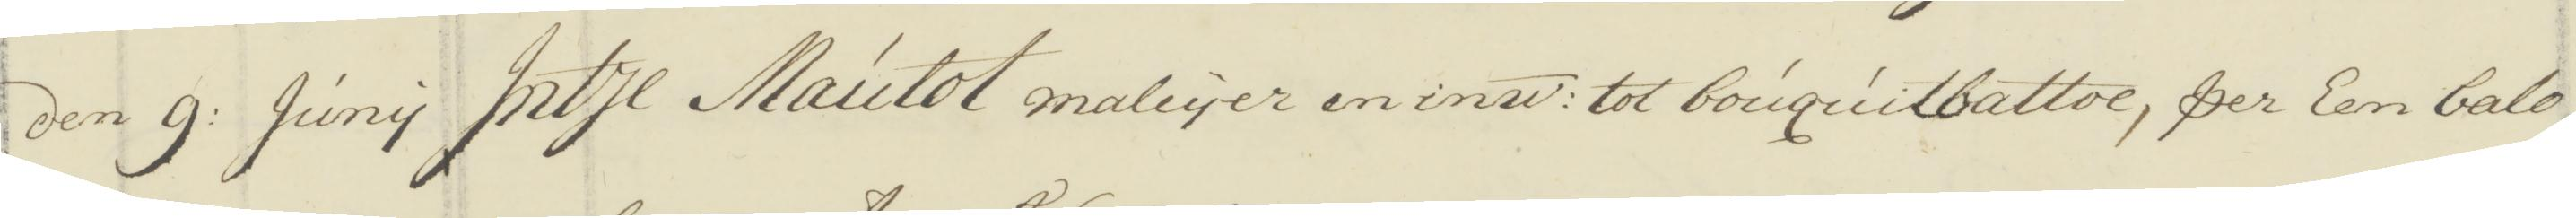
den 9: Junij Jntje Mautot maleijer en inw: tot bouquitbattoe, per Een balo
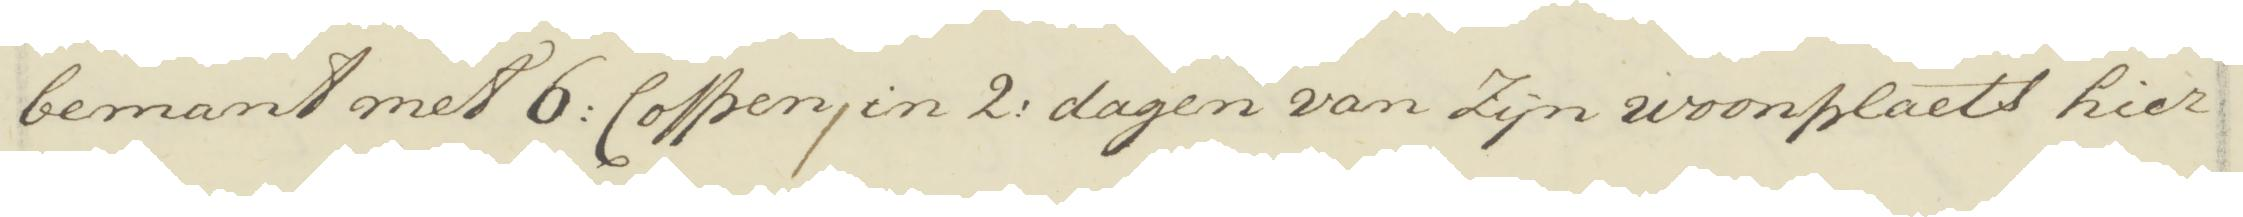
bemant met 6: Coppen, in 2: dagen van zijn woonplaets hier
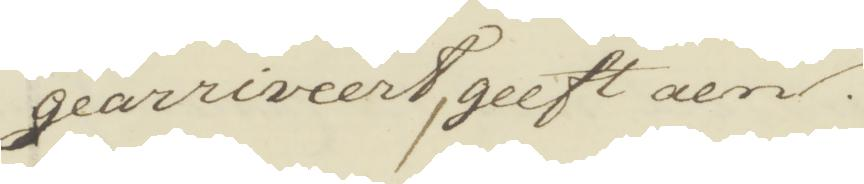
gearriveert, geeft aen.
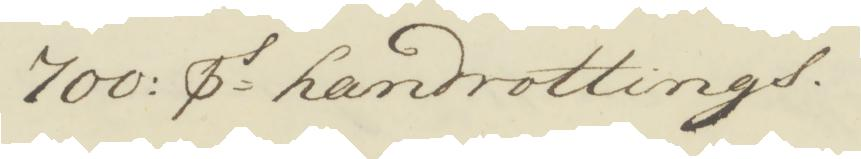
700: p=s handrottings.
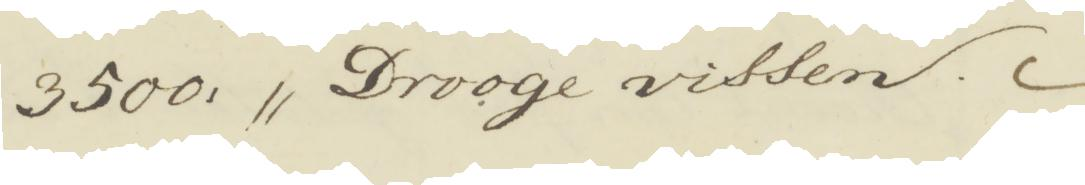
3500: „ Drooge vissen.
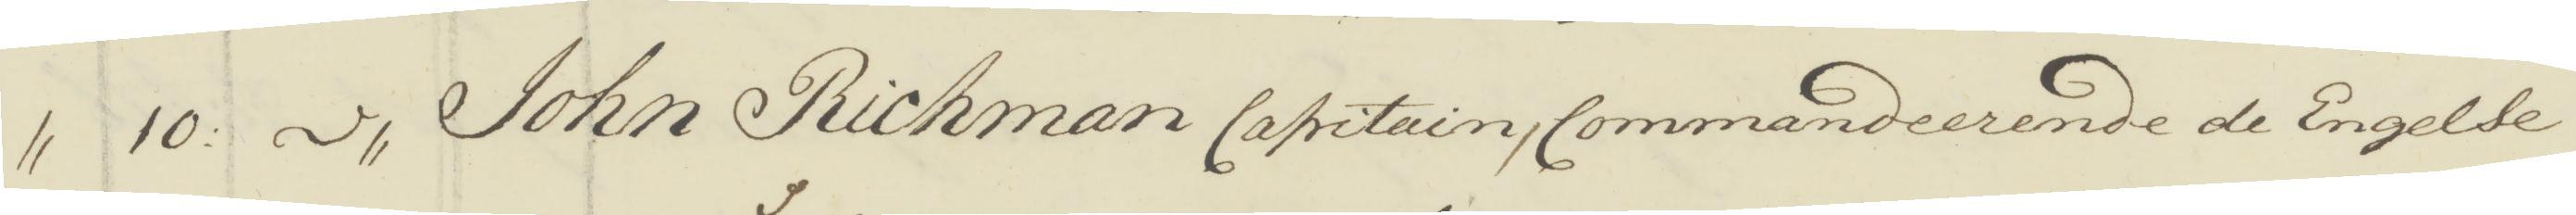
„ 10: d„ John Richman Capitain, Commandeerende de Engelse
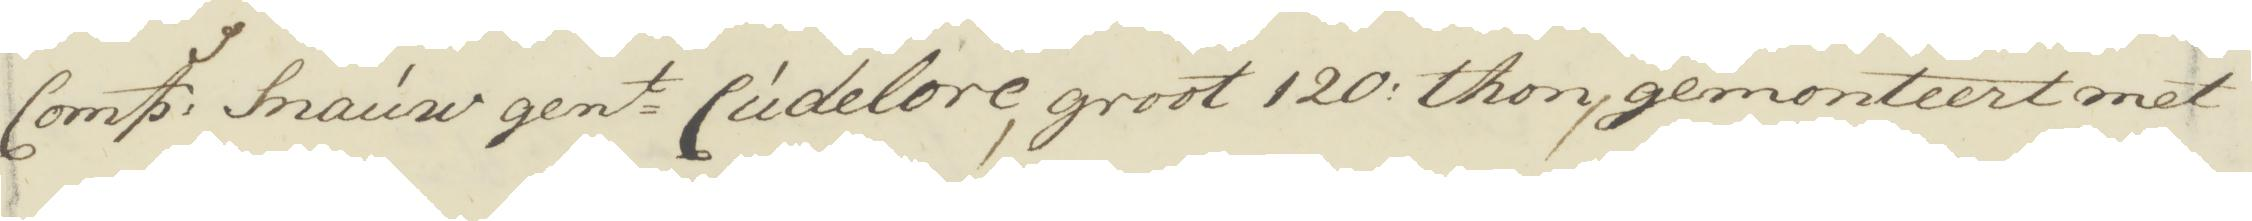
Comp:s snauw gen=t Cudelore, groot 120: thon, g'emonteert met
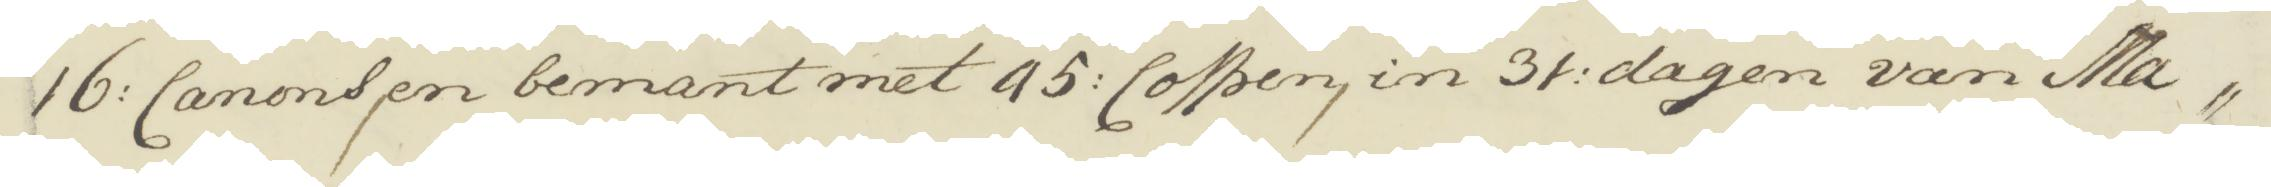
16: Canons, en bemant met 45: Coppen, in 31: dagen van Ma„
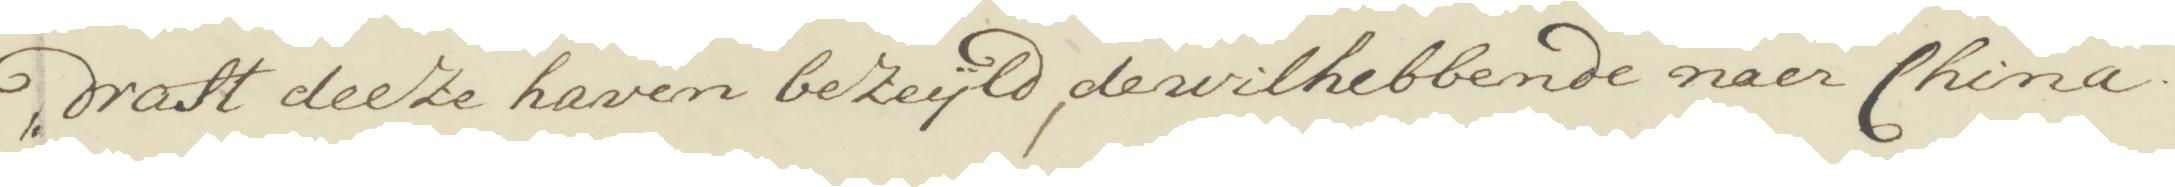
„drast deeze haven bezeijld, dewilhebbende naer China.
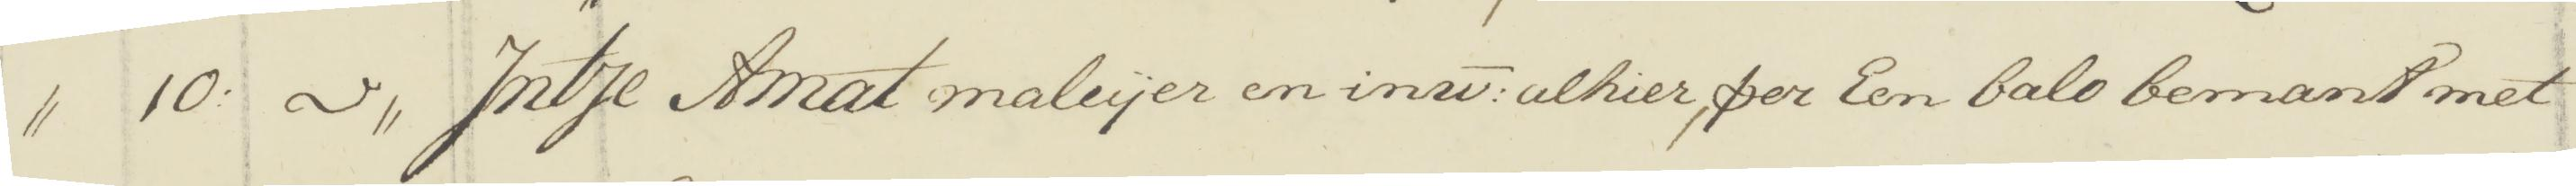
„ 10: d„ Jntje Amat maleijer en inw: alhier, per Een balo bemant met
